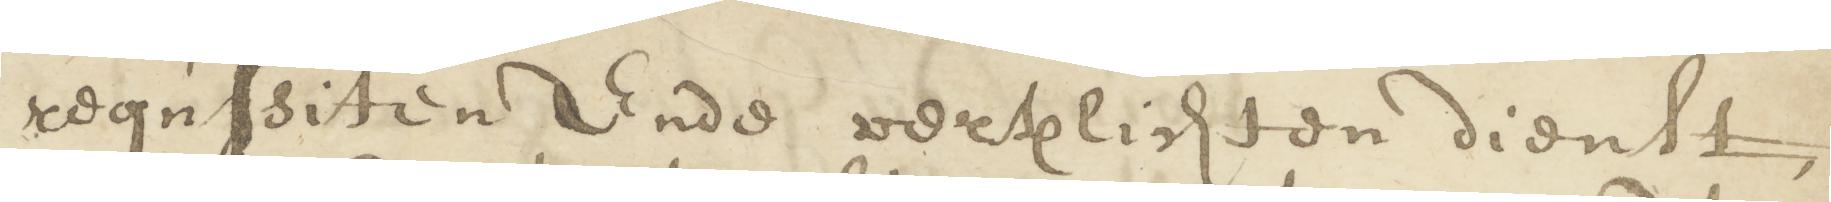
requjsiten Ende verplichten dienst,
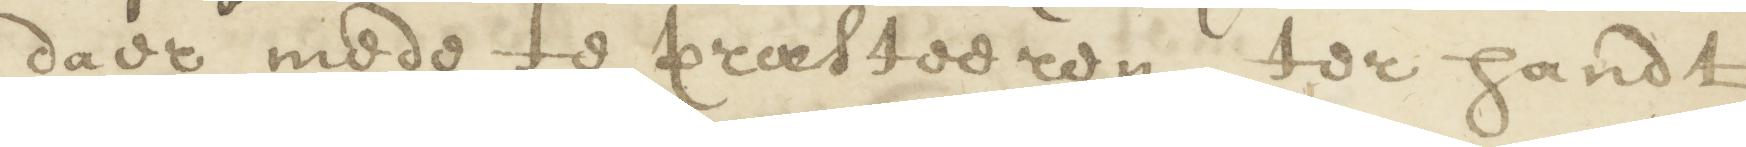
daer mede te praesteeren, ter handt
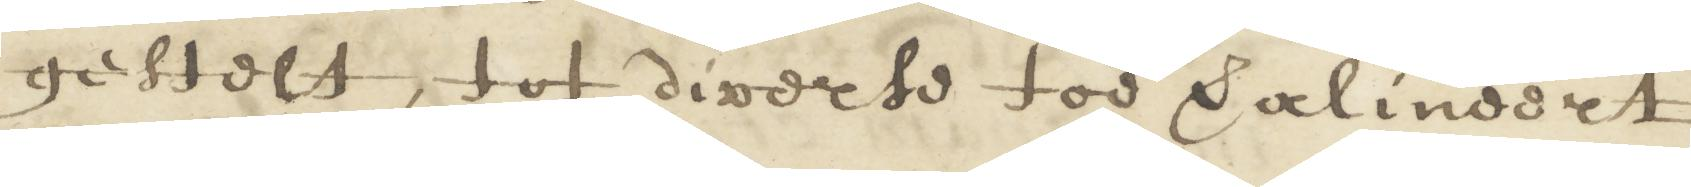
gestelt, tot diverse toe veralineert
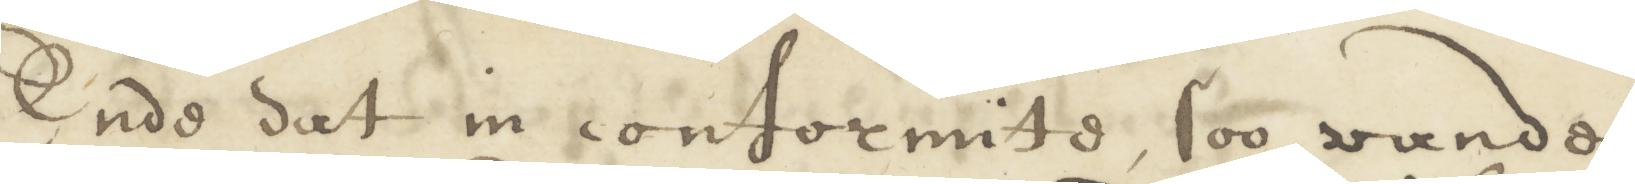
Ende dat in conformite, soo vande
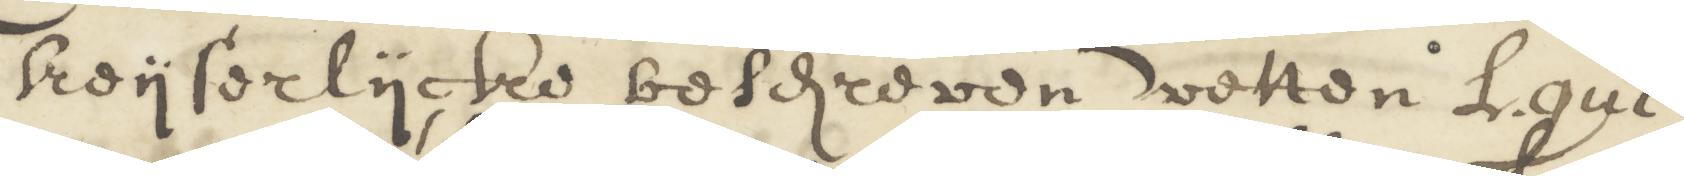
keijserlijcke beschreven wetten L. qui
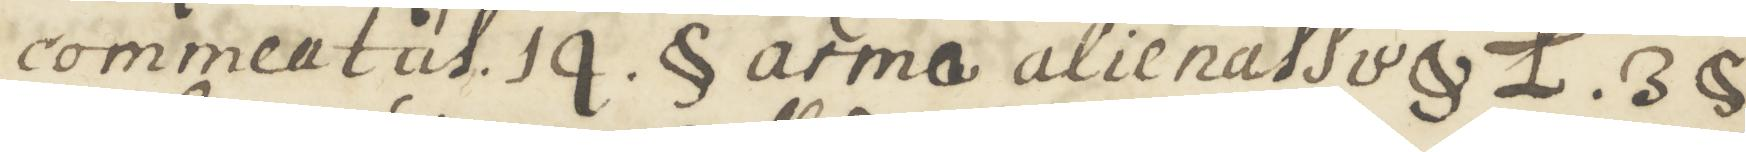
commentus. 14. § arma alienasse J L. 3 §
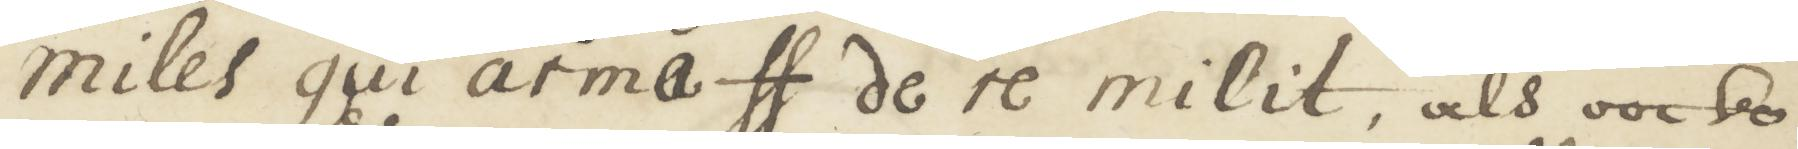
miles qui arma ff de re milit, als oock
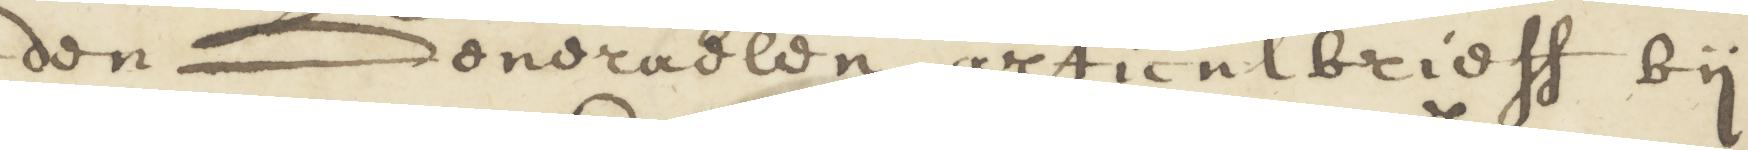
den Generaelen articulbrieff bij
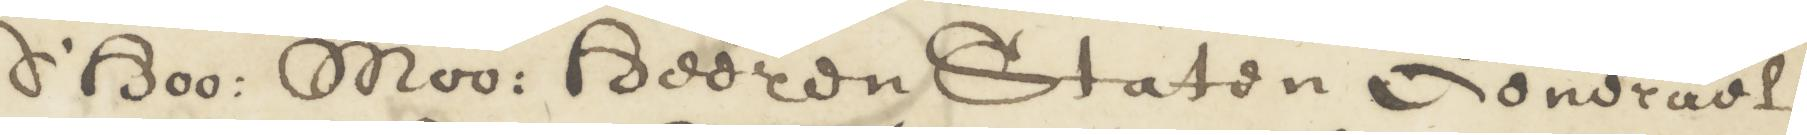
d’hoo: moo: heeren Staten Generael
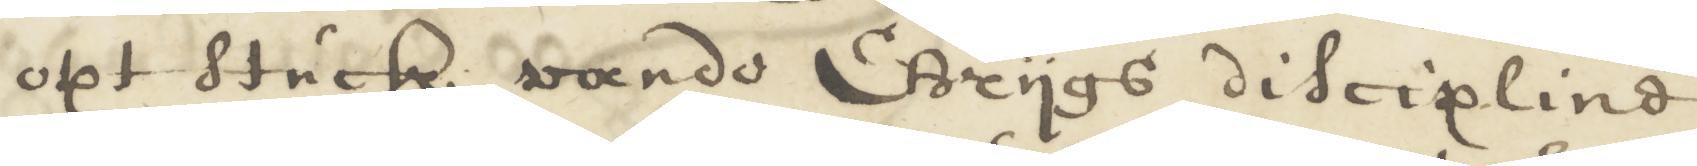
opt stuck vande Chrijgs discipline
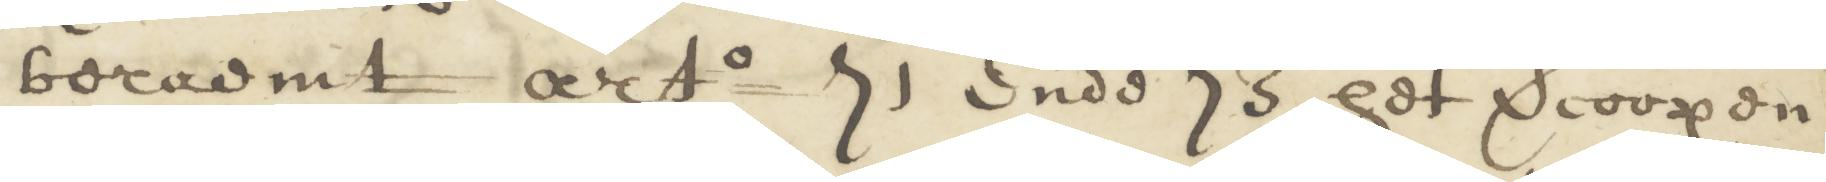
beraemt art=o 71 ende 73 het vercoopen
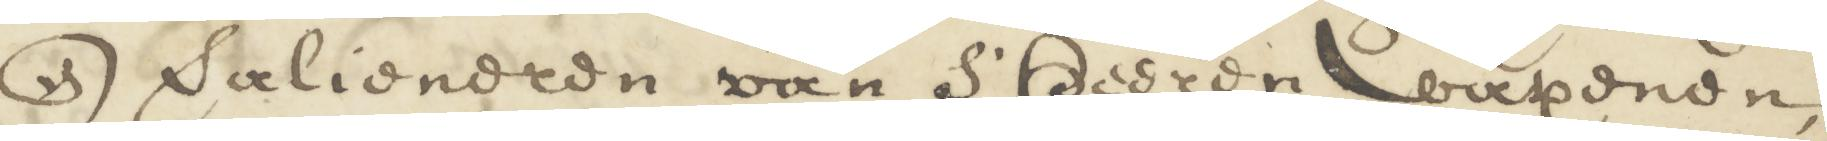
ende veralieneren van s'heeren wapenen,
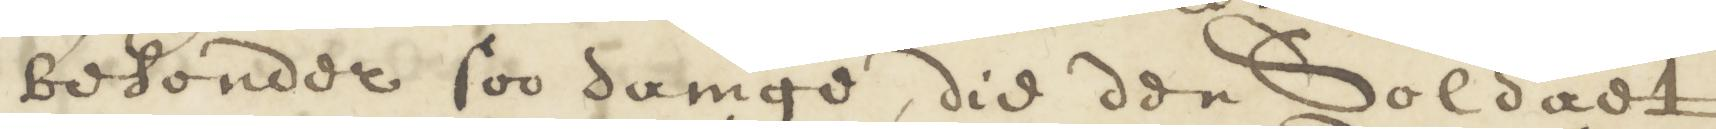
besonder soo danige, die den soldaet
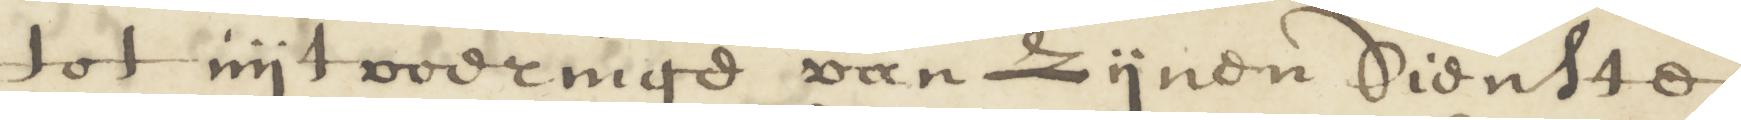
tot uijtvoeringe van zijnen dienste
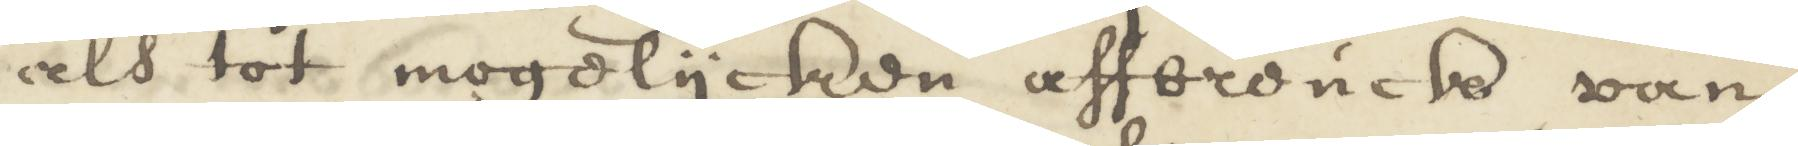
als tot mogelijcken affbreuck van
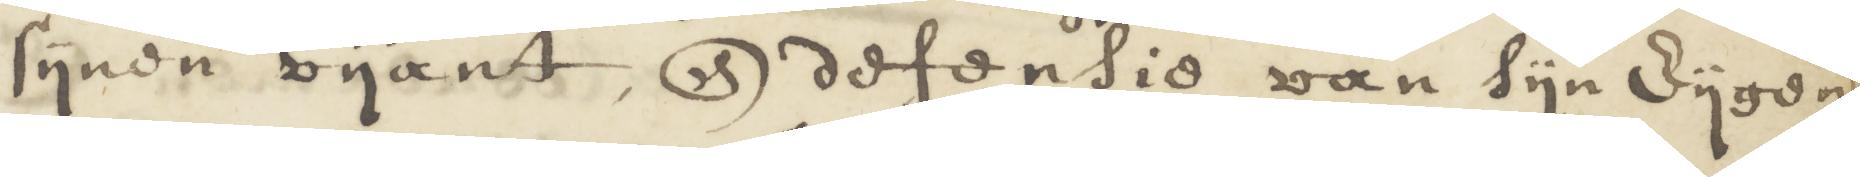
sijnen vijant, ende defensie van sijn Eijgen
